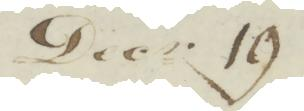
Dec.r 19
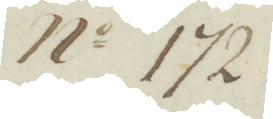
N=o 172
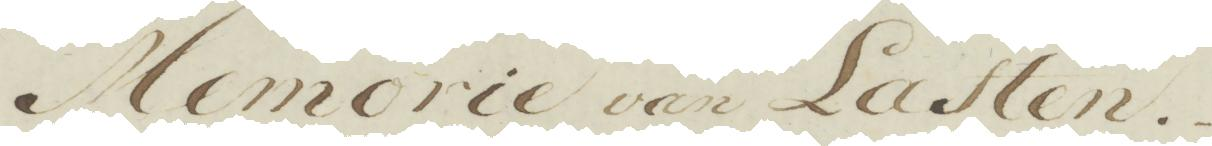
Memorie van Lasten.-
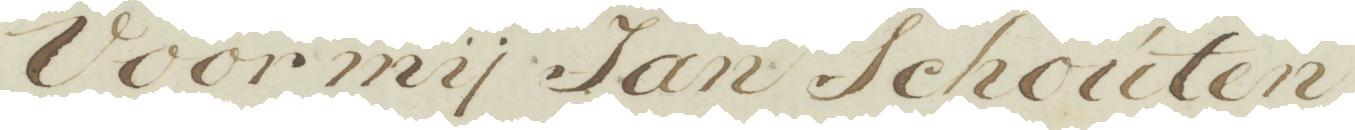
Voor mij Jan Schouten
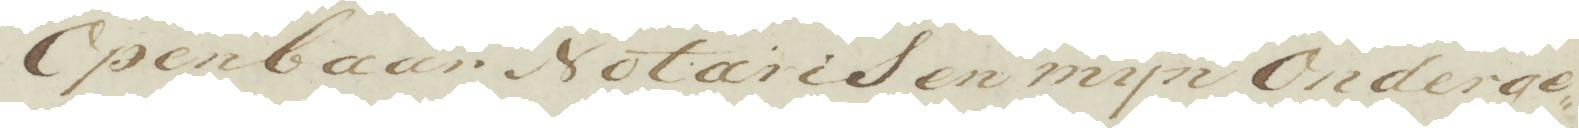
Openbaar Notaris en mijn onderge„
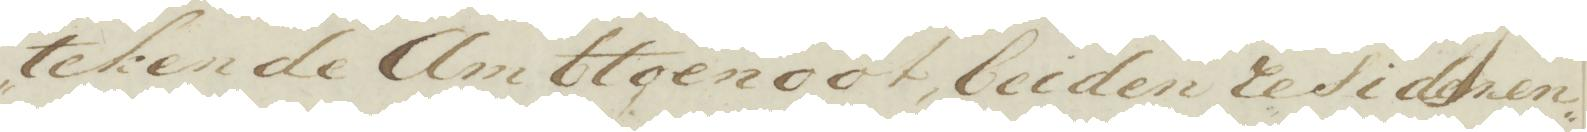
„tekende Ambtgenoot, beiden resideren„
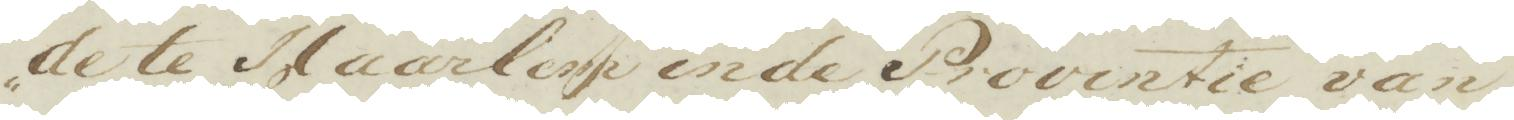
„de te Haarlem inde Provintie van
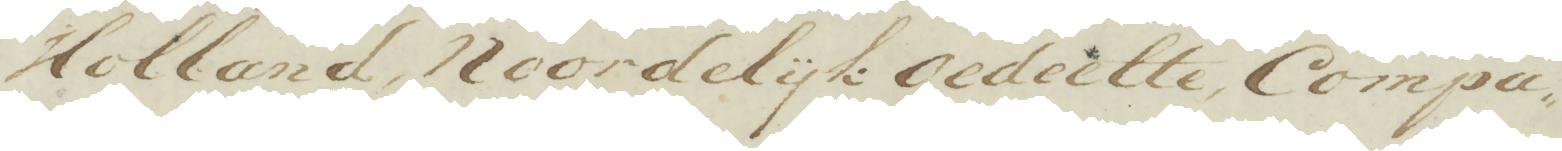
Holland, Noordelijk gedeelte, Compa„
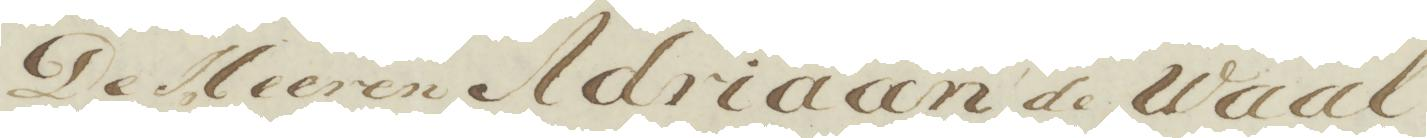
De Heeren Adriaan de Waal
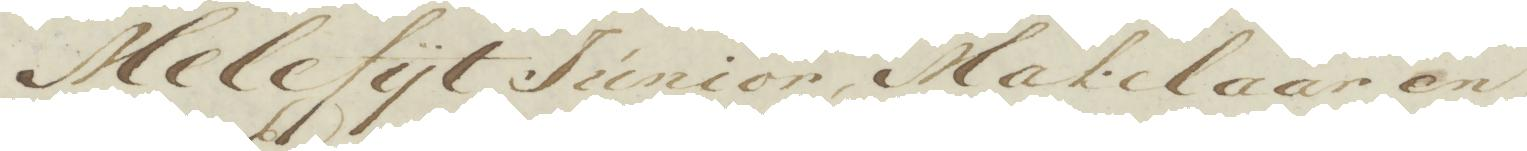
Melefijt Junior, Makelaar en
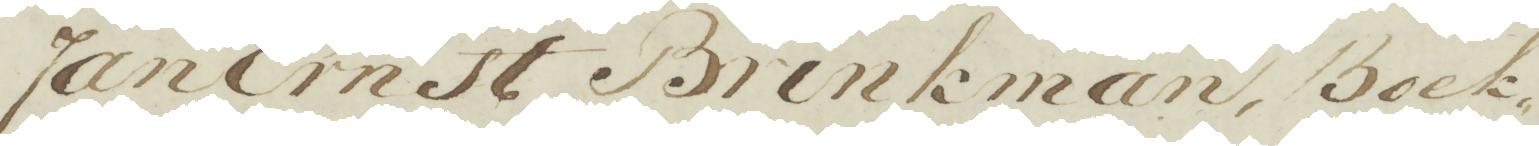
Jan Ernst Brinkman, Boek„
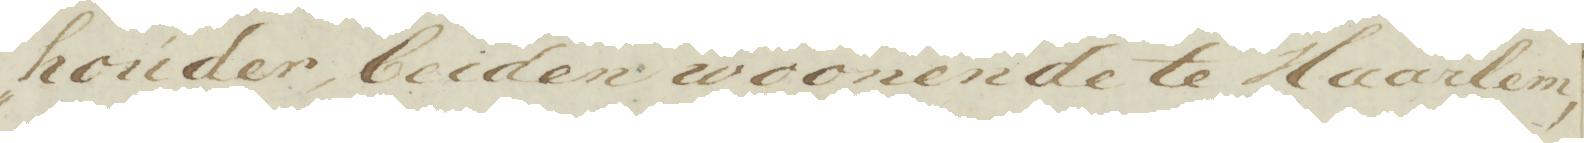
„houder, beiden woonende te Haarlem,
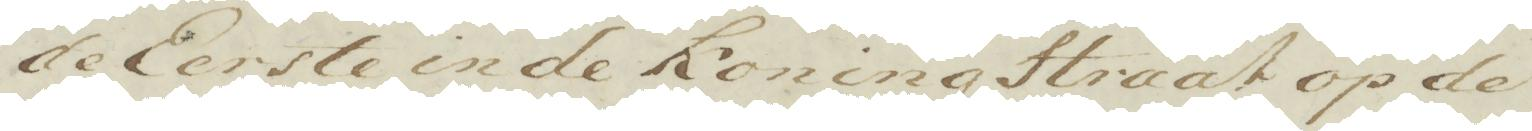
de Eerste in de Koningstraat op de
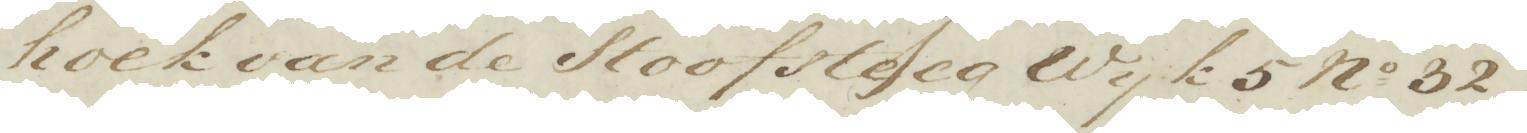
hoek van de Stoofsteeg Wijk 5 N=o 32
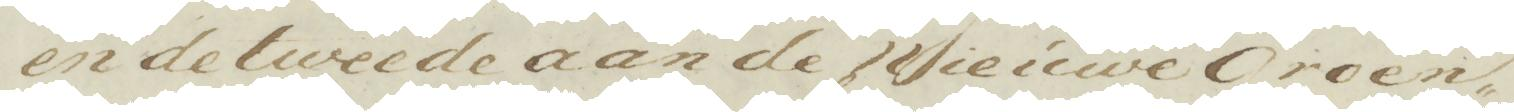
en de tweede aan de Nieuwe Groen„
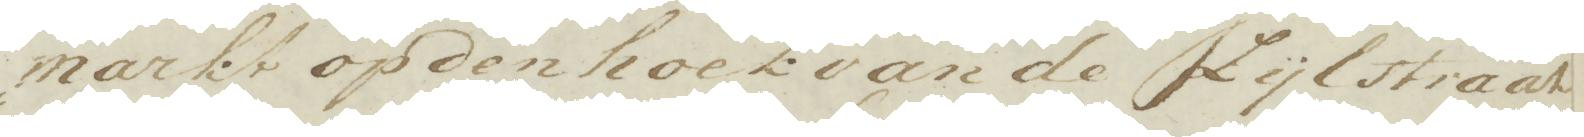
markt op den hoek van de Zijlstraat
